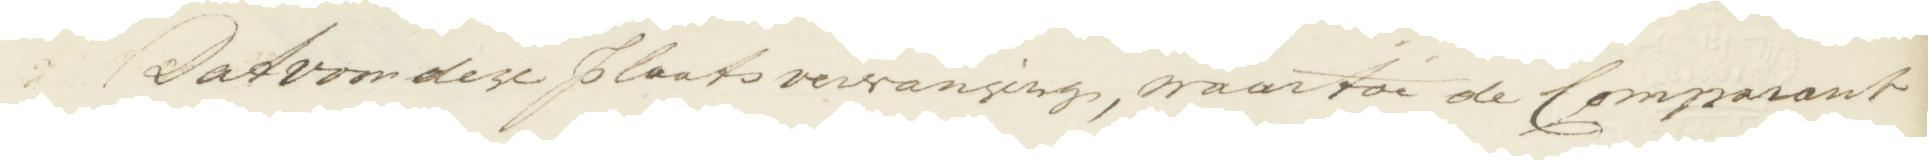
Dat voor deze plaats vervanging, waartoe de Comparant
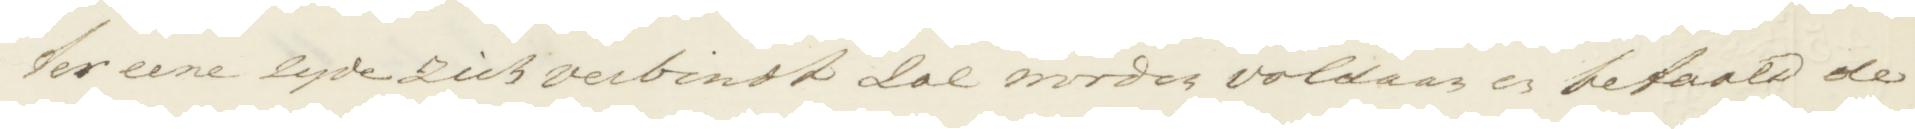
ter eene zyde zich verbindt zal worden voldaan en betaald de
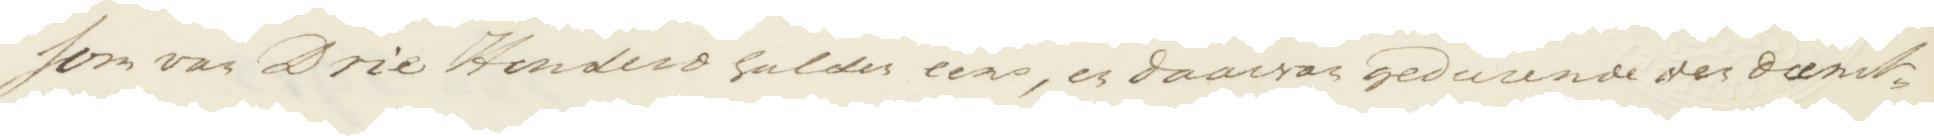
som van Drie Honderd Gulden eens, en daarvan gedurende den dienst„
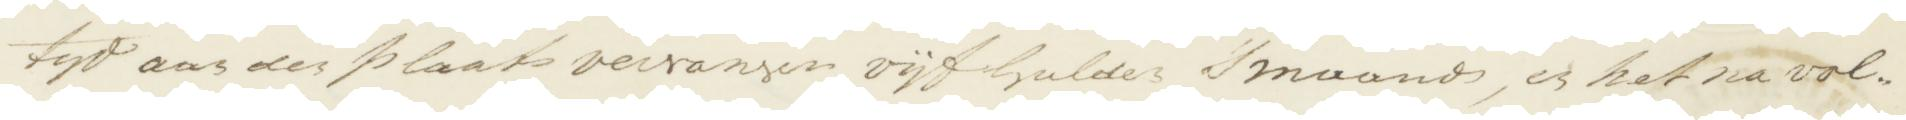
tyd aan den plaats vervangen vijf Gulden 's maands, en het na vol„
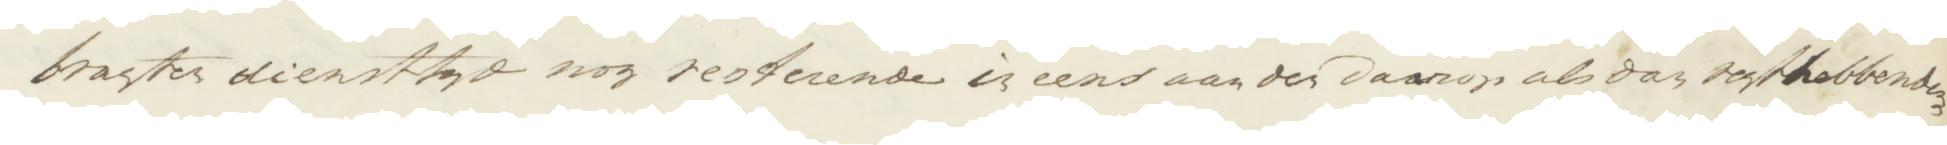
bragten diensttyd nog resterende in eens aan den daarop als dan regt hebbend
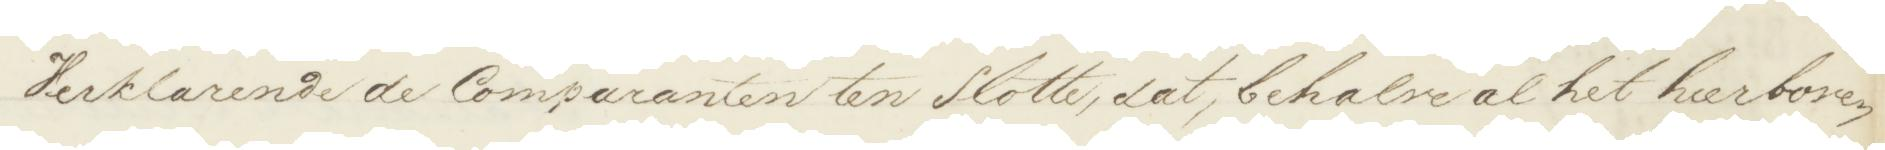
Verklarende de Comparanten ten slotte, dat, behalve al het hierboven
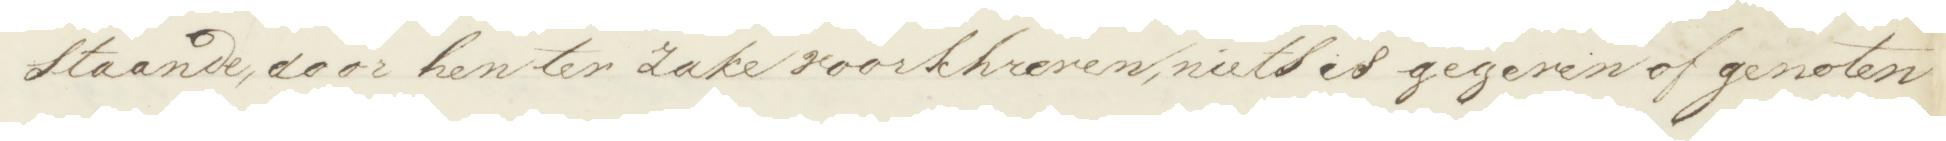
staande, door hen ter zake voorschreven, niets is gegeven of genoten
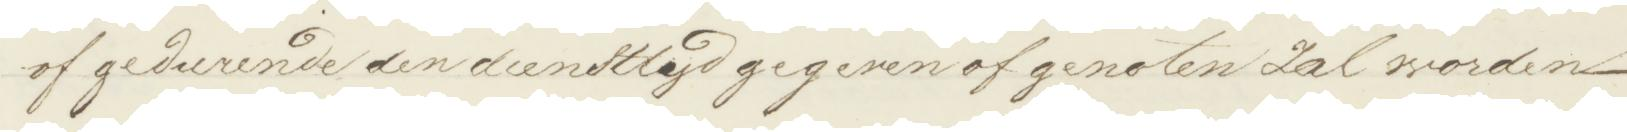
of gedurende den diensttijd gegeven of genoten zal worden
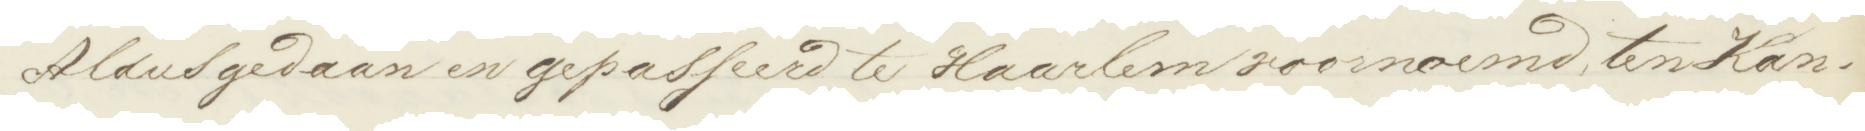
Aldus gedaan en gepasseerd te Haarlem voornoemd, ten Kan„
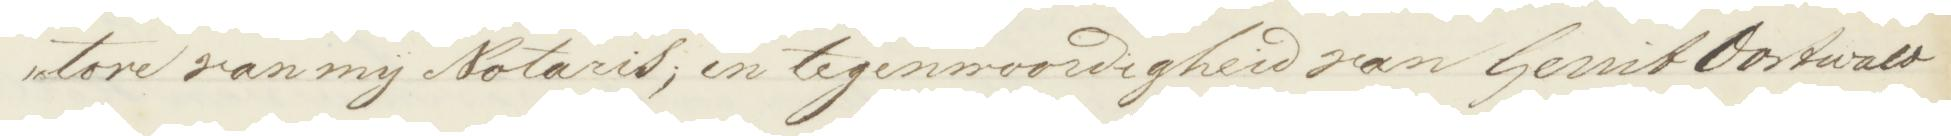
„tore van mij Notaris; in tegenwoordigheid van Gerrit Oostwald
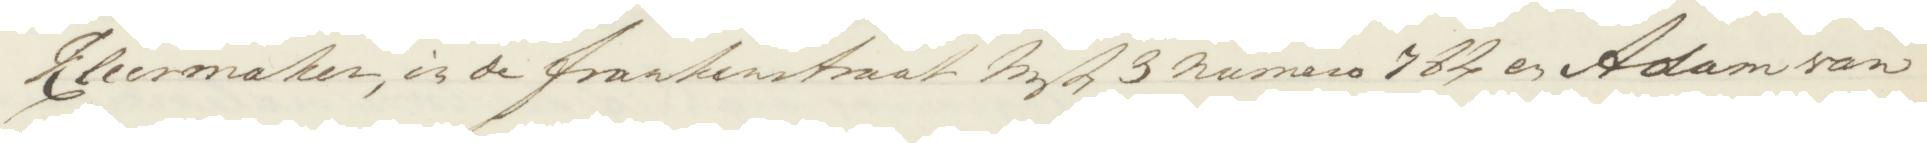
Kleermaker, in de frankenstraat Wyk 3 numero 782 en Adam van
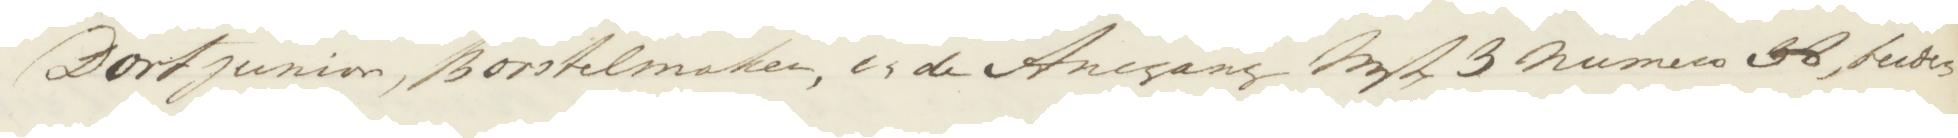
Dort Junior, Borstelmaker, in de Anegang Wyk 3 numero 38, beiden
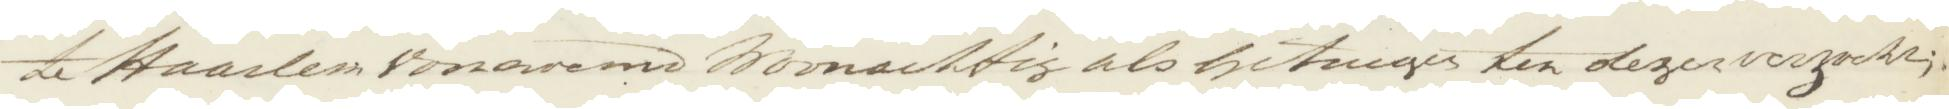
te Haarlem voornoemd woonachtig als Getuigen ten dezen verzocht
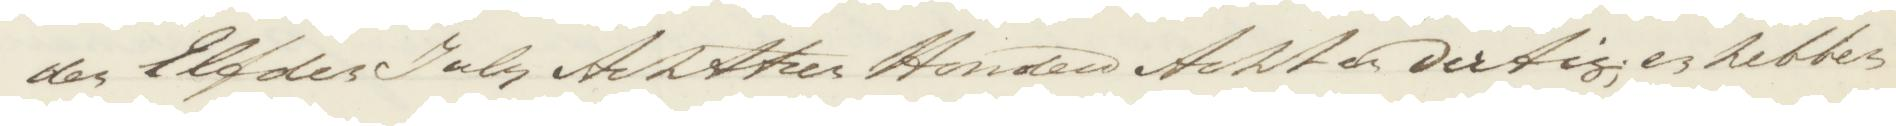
den Elfden July Achttien Honderd Acht en dertig; en hebben
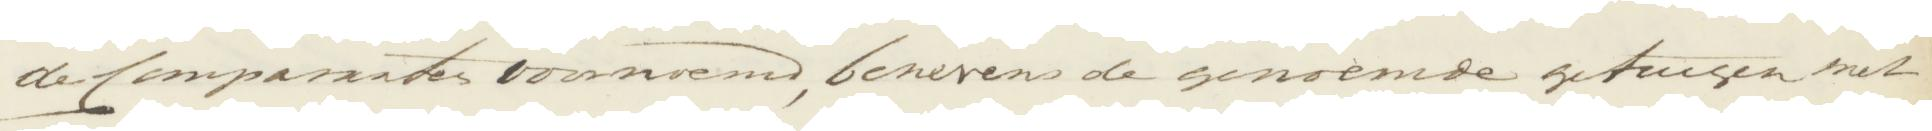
de Comparanten voornoemd, benevens de genoemde getuigen met
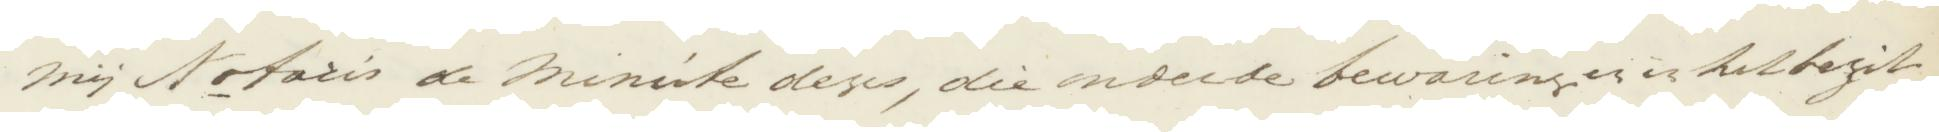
mij Notaris de minute dezes, die onder de bewaring en in het bezit
